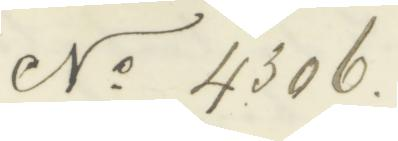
N.o 4306.
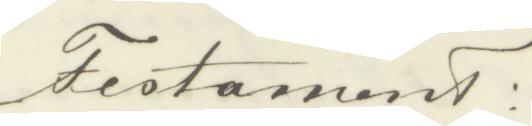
Testament:
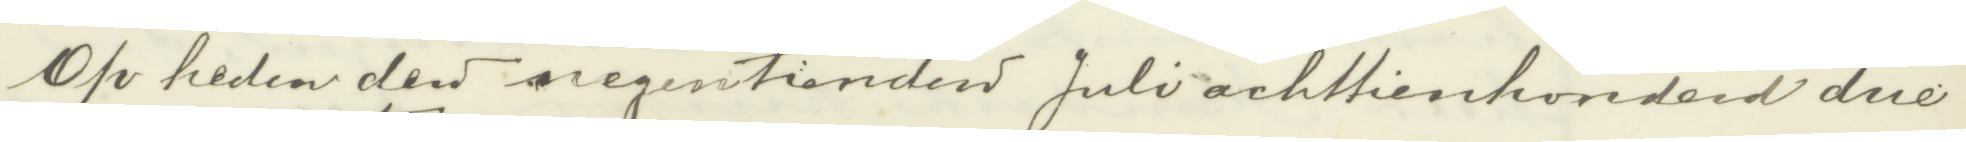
Op heden den negentienden Juli achttienhonderd drie
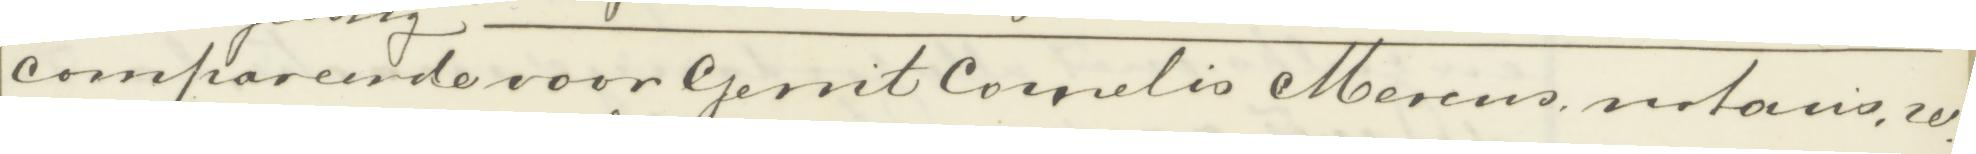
compareerde voor Gerrit Cornelis Merens, notaris, re.
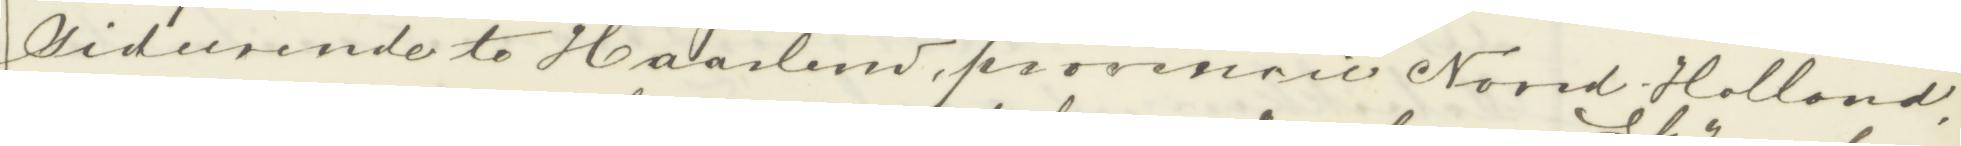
sideerende te Haarlem, provincie Noord-Holland,
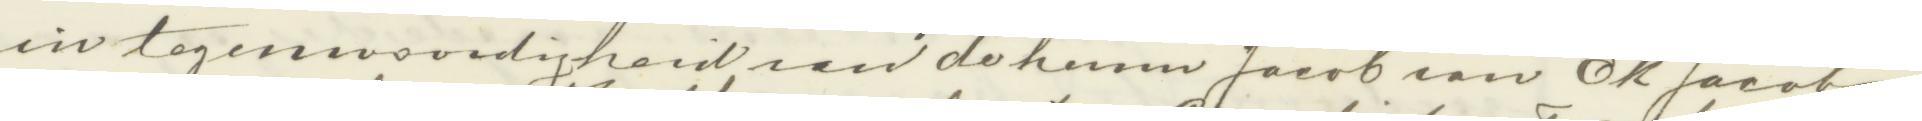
in tegenwoordigheid van de heren Jacob van Ek Jacobs
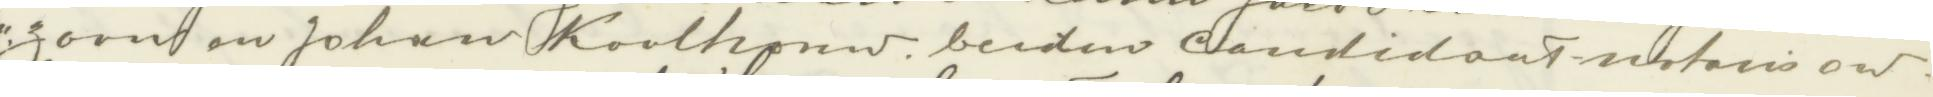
zoon en Johan Koolhove, beiden Candidaat-notaris on
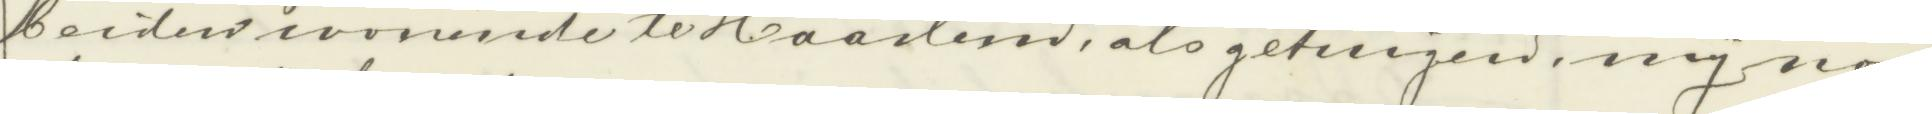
beiden wonende te Haarlem, als getuigen, mij no
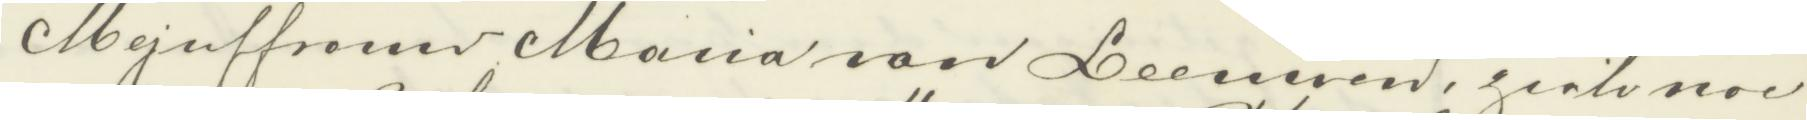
Mejuffrouw Maria van Leeuwen, zich noe
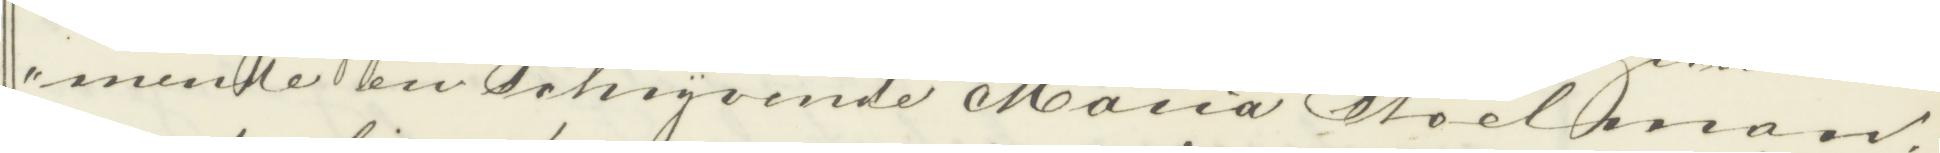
„mende en schrijvende Maria Stoelman,
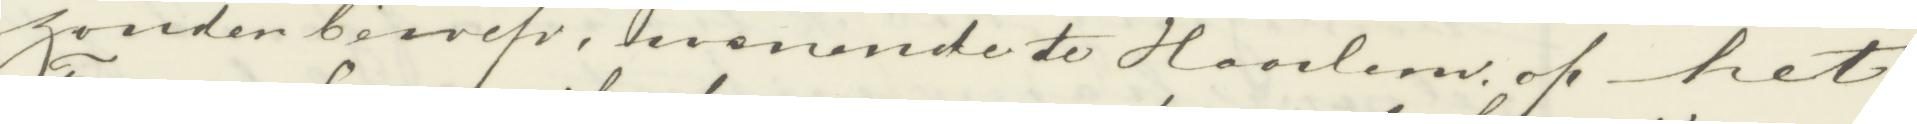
zonder beroep, wonende te Haarlem, op het
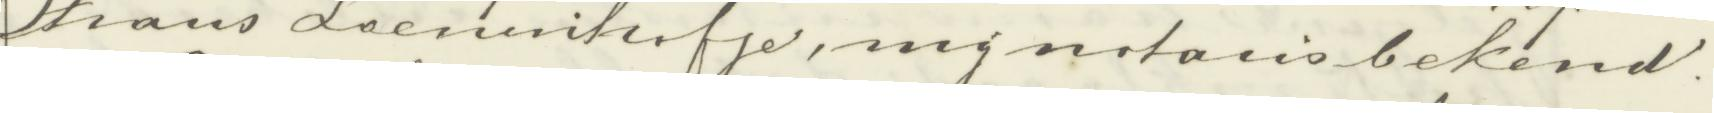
Frans Loenenhofje, mij notaris bekend.
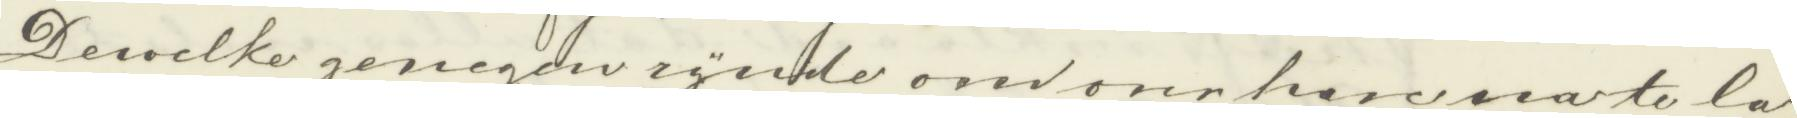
Dewelke genegen zijnde om over hare na te la
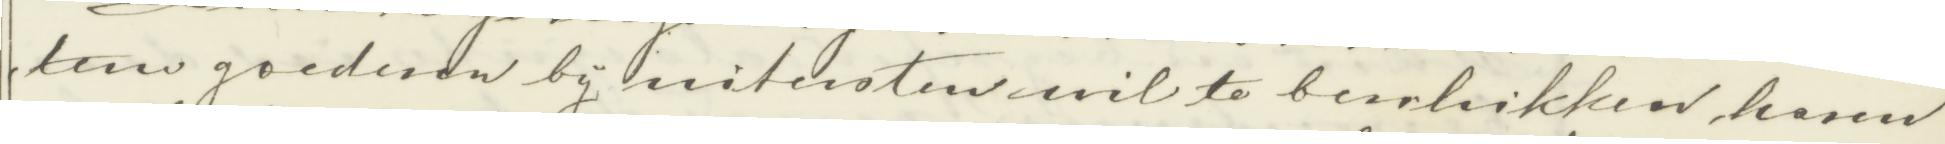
ten goederen bij uitersten wil te beschikken, haren
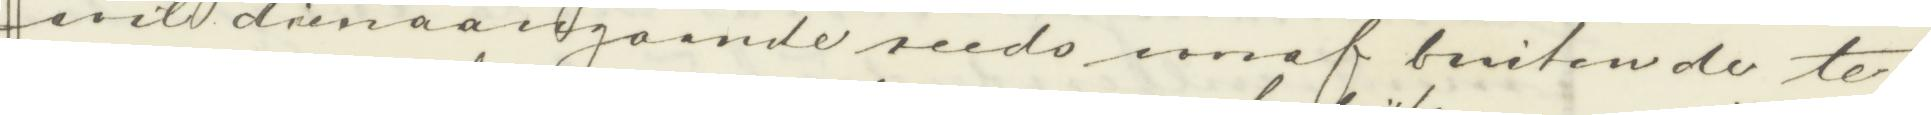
wil dienaangaande reeds vooraf buiten de te:
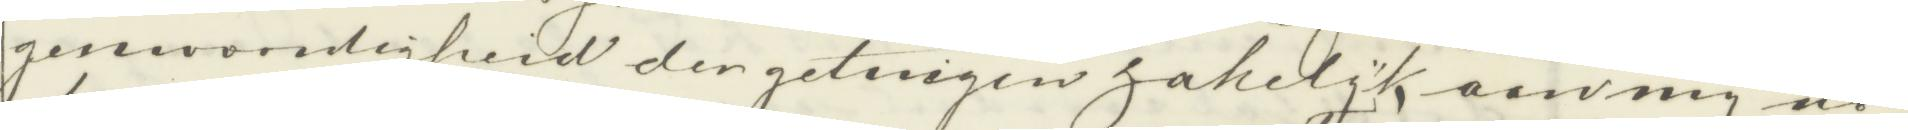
genwoordigheid der getuigen zakelijk aan mij no,
